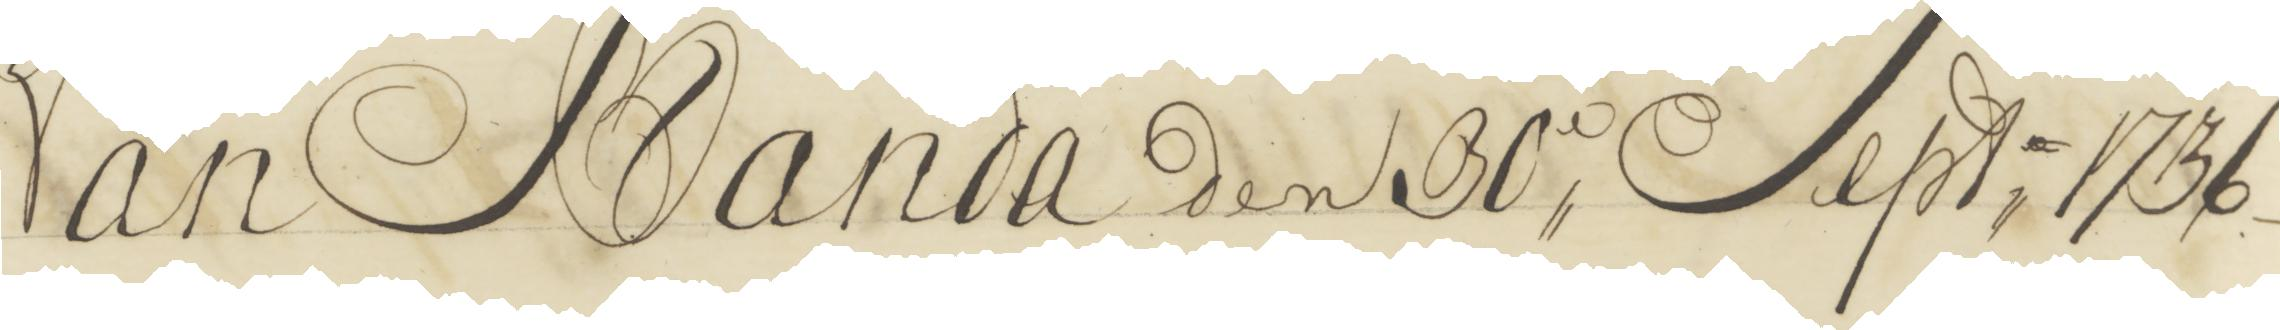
Van Banda den 30„e Sept„r 1736. —
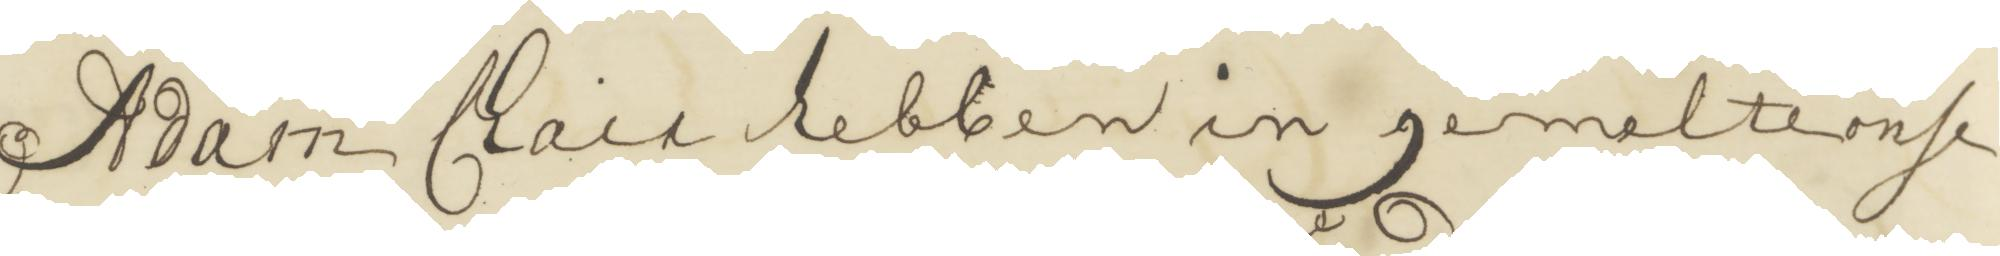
Adam Chair hebben in gemelte onse
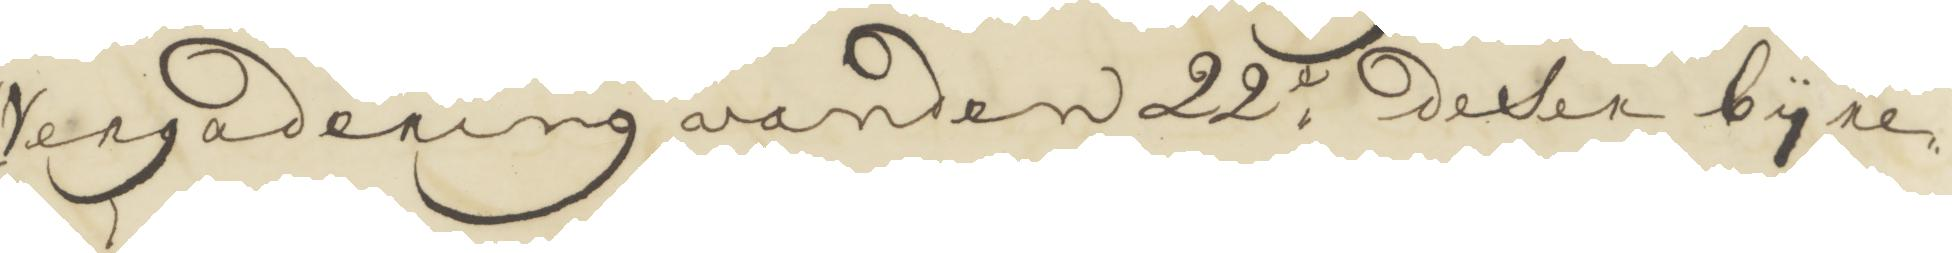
Vergadering van den 22„e deser bij re„
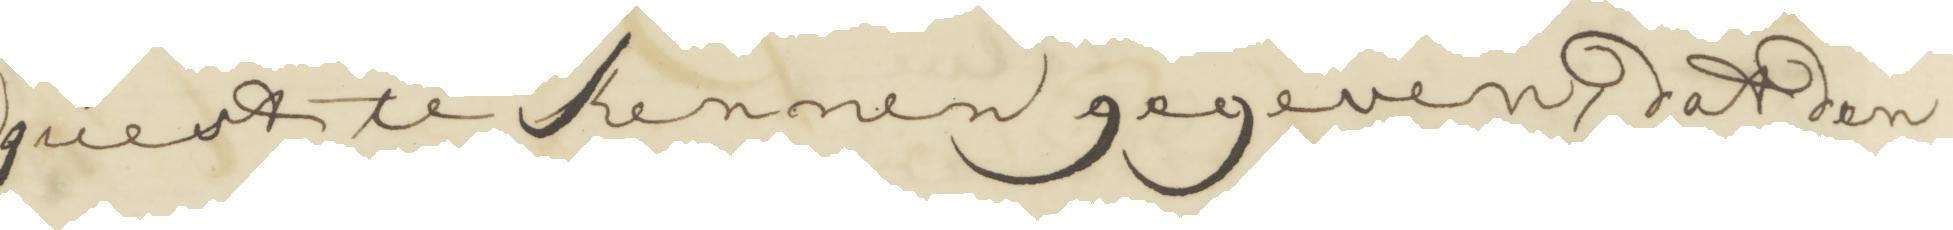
quest te kennen gegeven, dat den
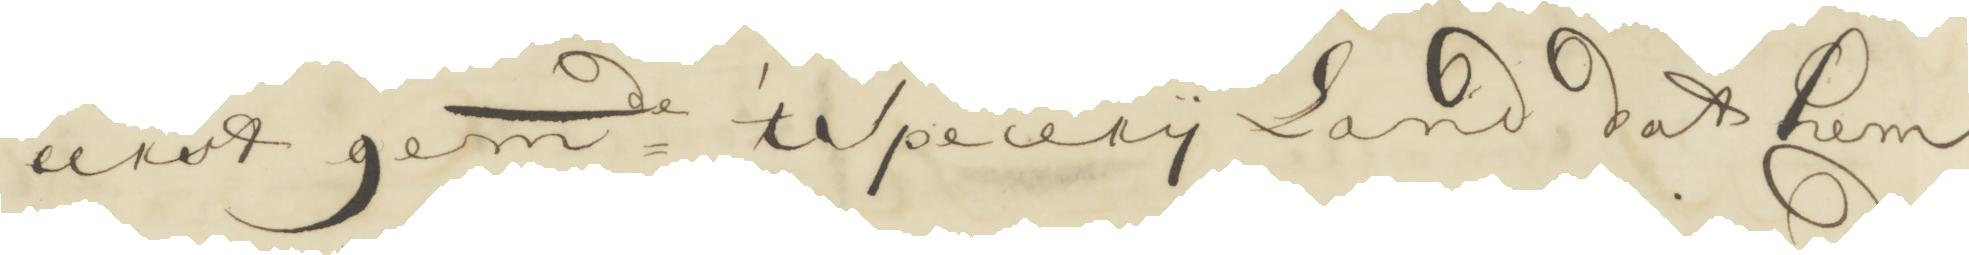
eerst gem=de 't specerij Land dat hem
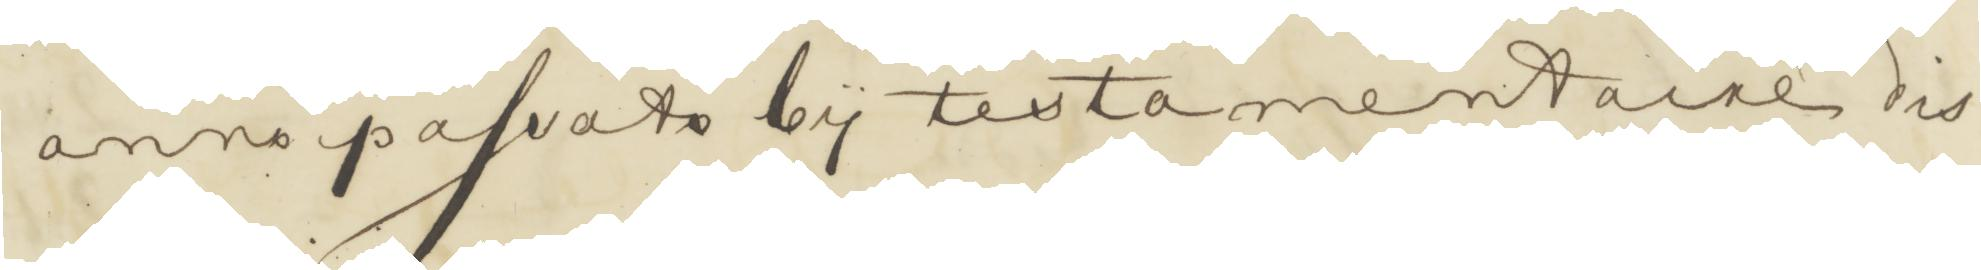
anno passato bij testamentaire dis
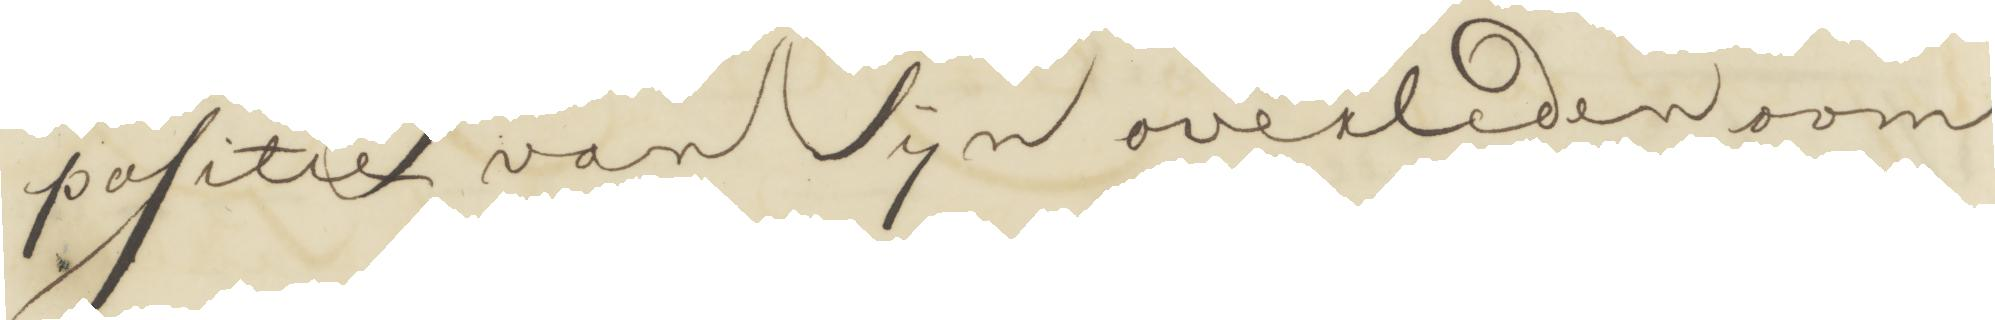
positie van sijn overleden oom
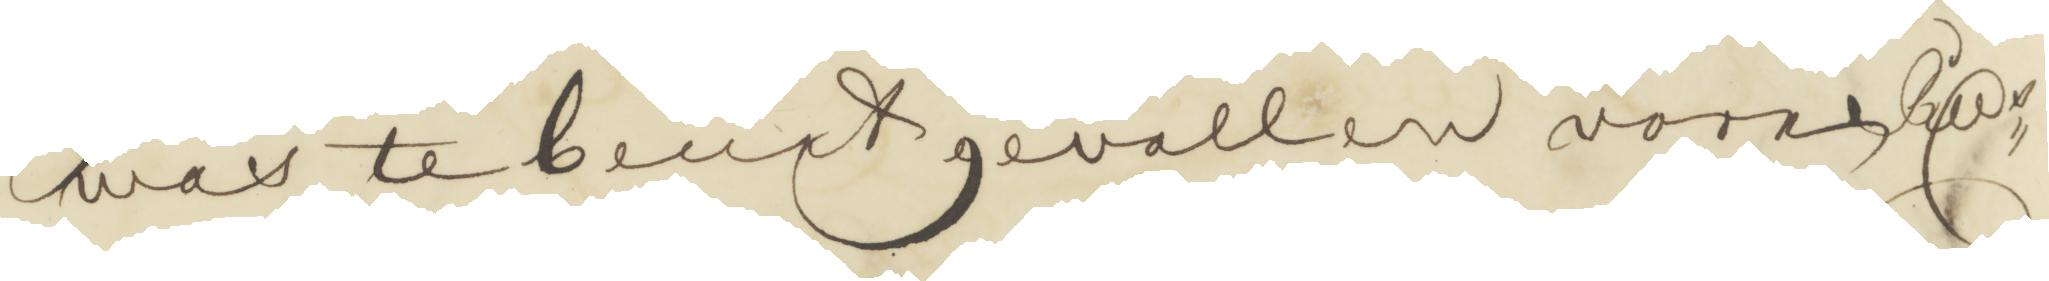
was te beurt gevallen voor Rd„s
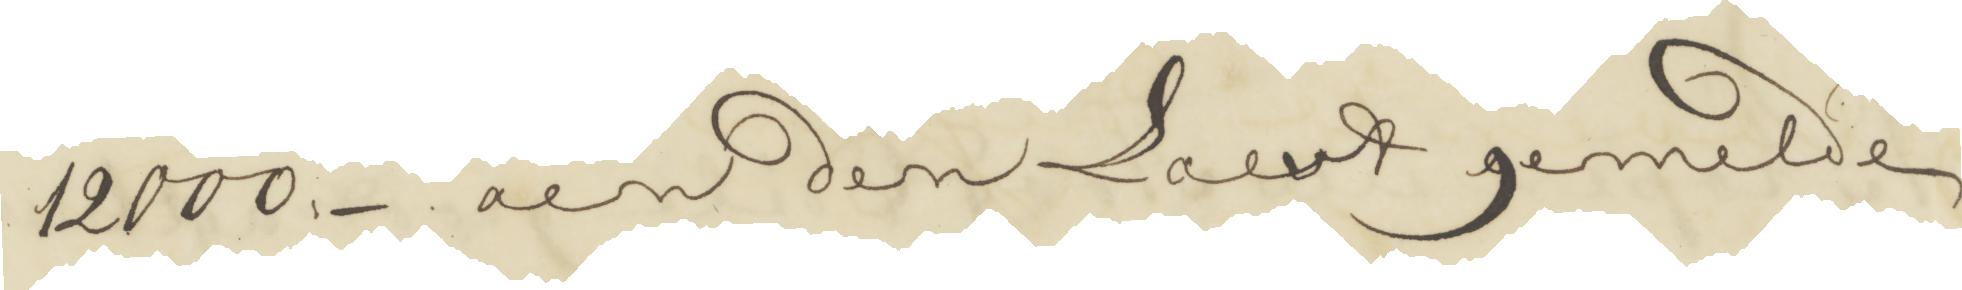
12000: — aen den Laest gemelde
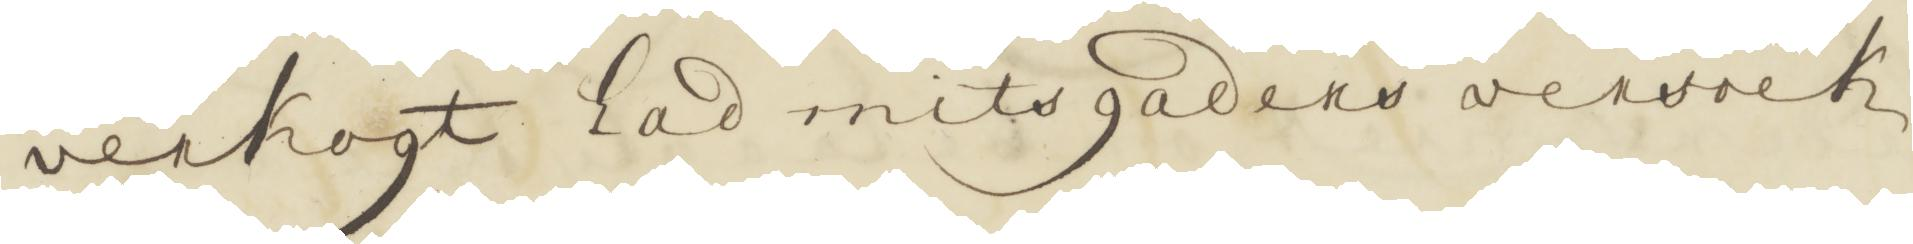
verkogt had mitsgaders versoek
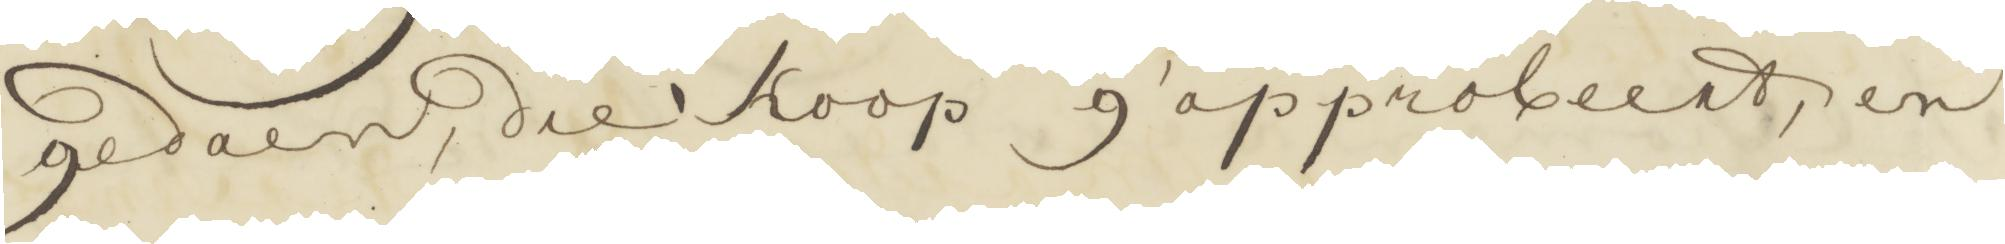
gedaen, die koop g’approbeert, en
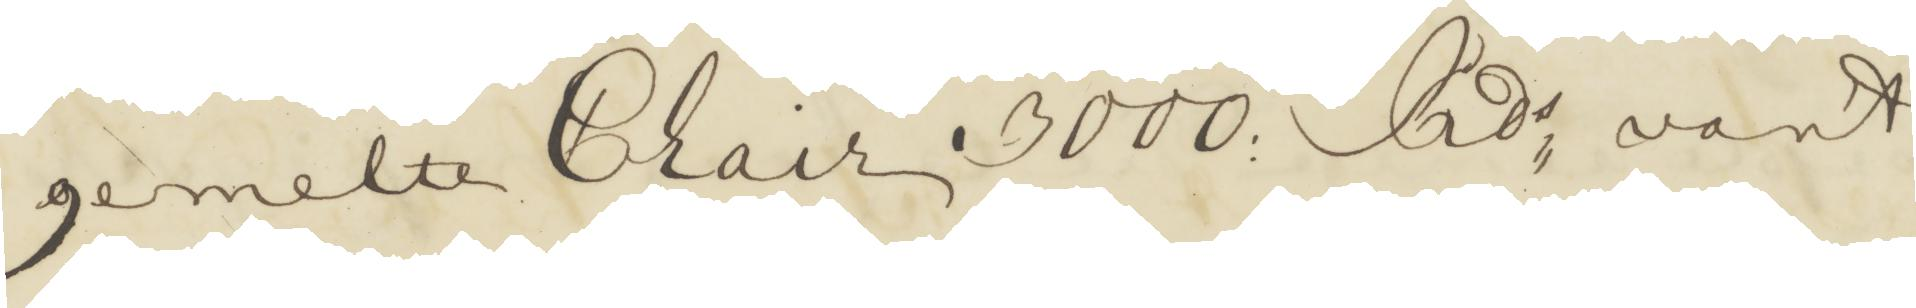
gemelte Chair 3000: Rd„s van't
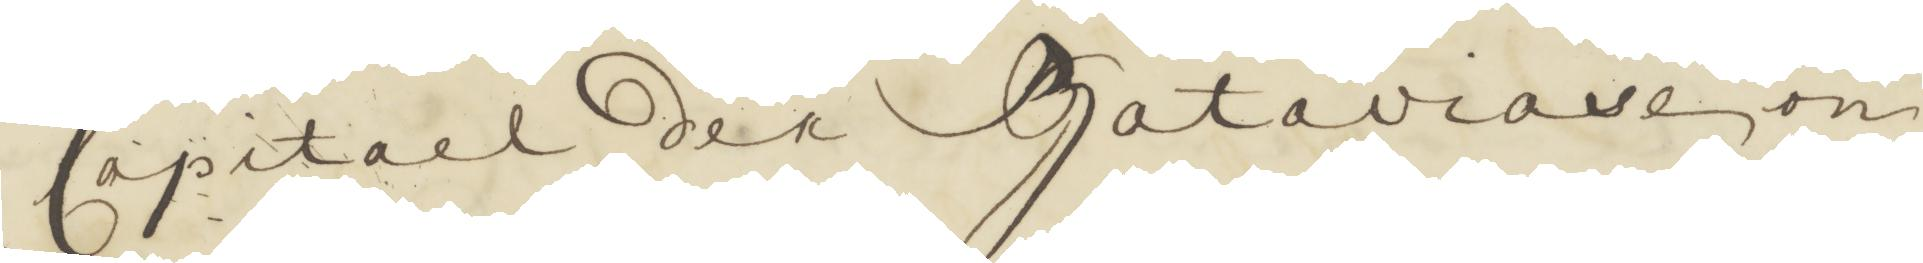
Capitael der Bataviase on
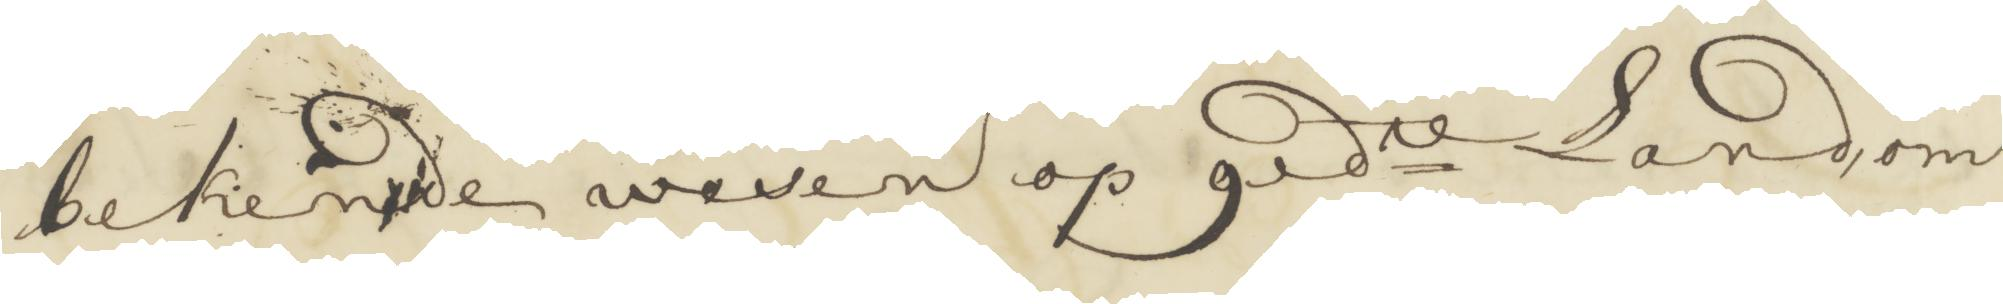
bekende wesen op ged=te Land, om
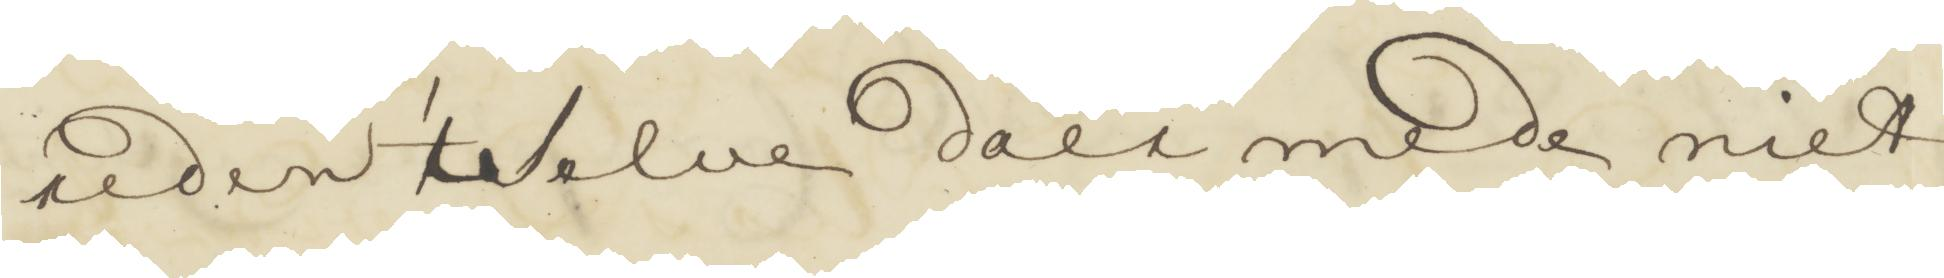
reden 'tselve daer mede niet
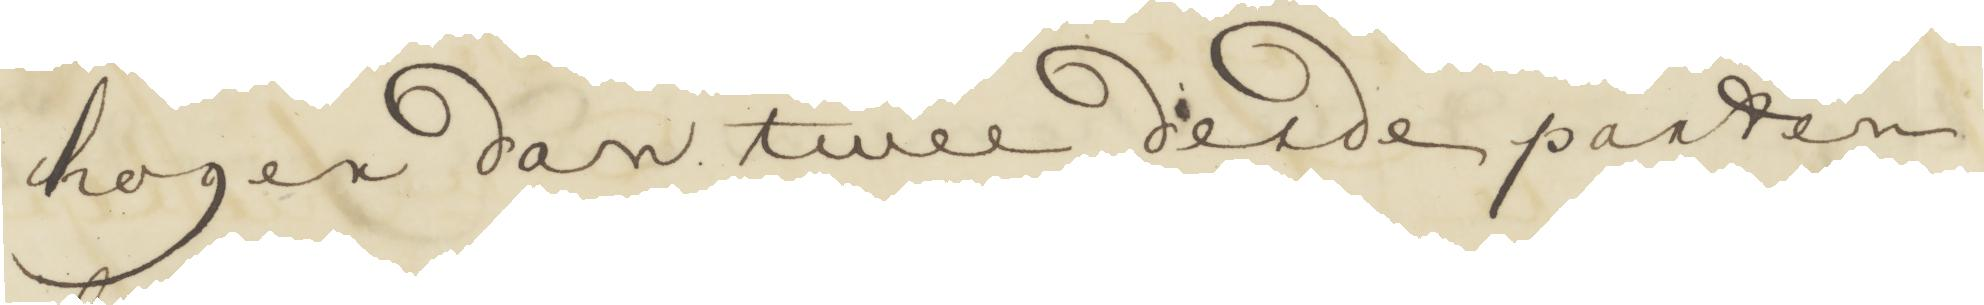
hoger dan twee derde parten
